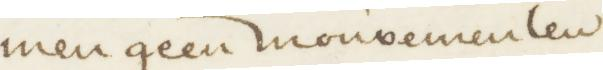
men geen mouvementen
